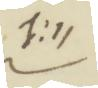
1:„
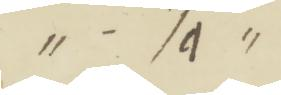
„ - ¼ „
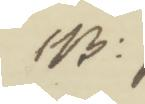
113:
